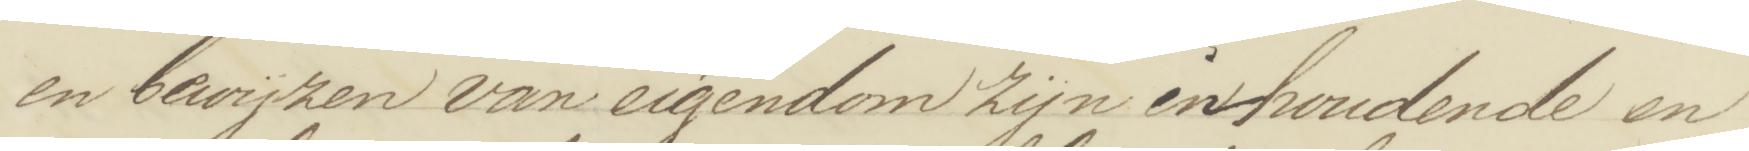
en bewijzen van eigendom zijn inhoudende en
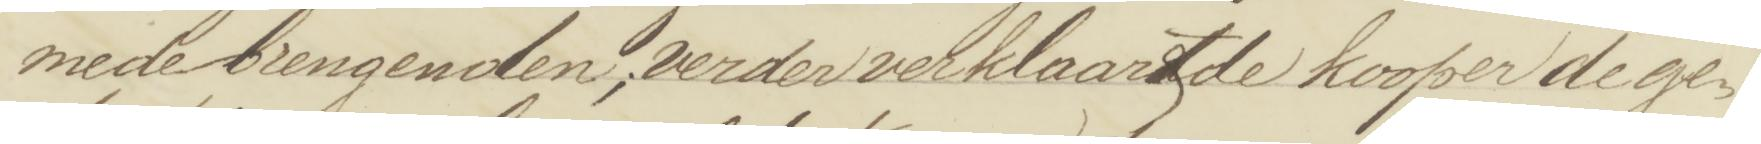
mede brengenden; verder verklaartde kooper de ge
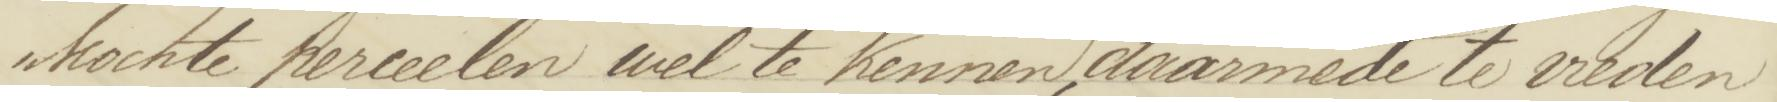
„kochte perceelen wel te kennen, daarmede te vreden
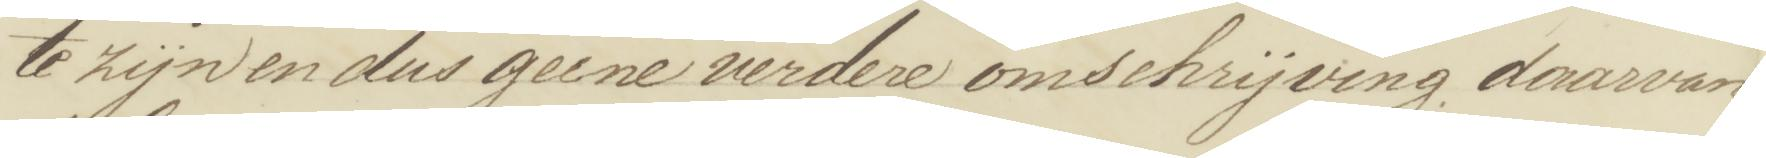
te zijn en dus geene verdere omschrijving daarvan
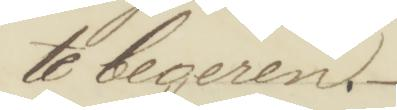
te begeren. —
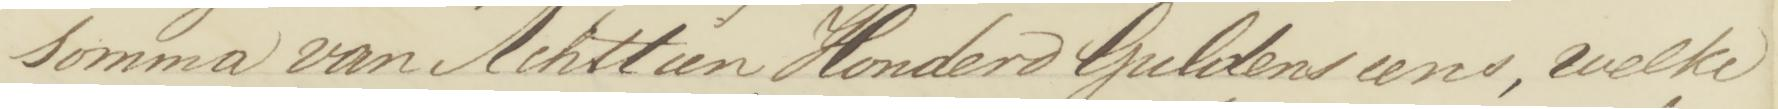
somma van Achttien Honderd Guldens eens, welke
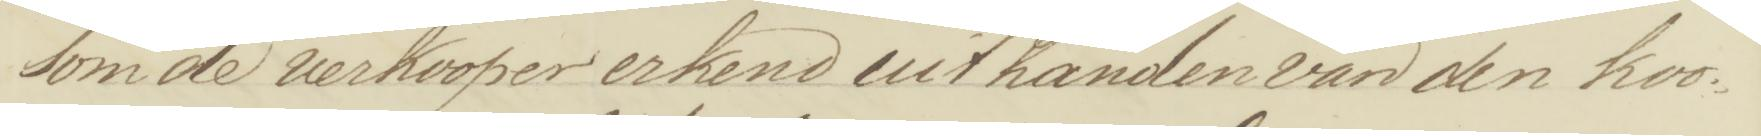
som de verkooper erkend uit handen van den koo„
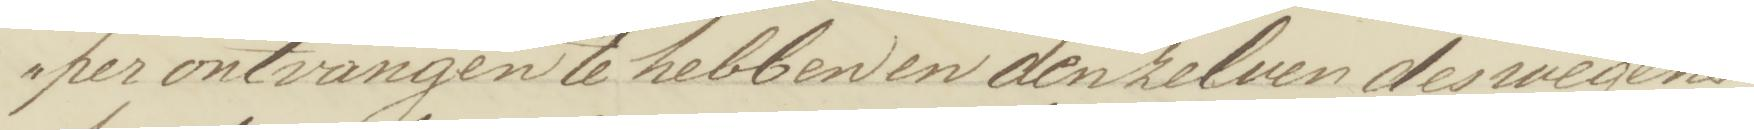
„per ontvangen te hebben en denzelven des wegens
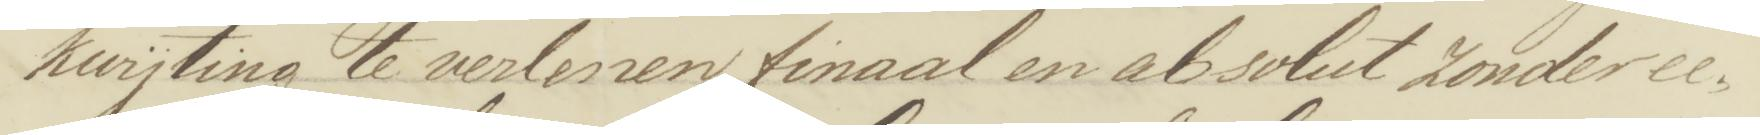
kwijting te verlenen, finaal en absolut zonder ee„
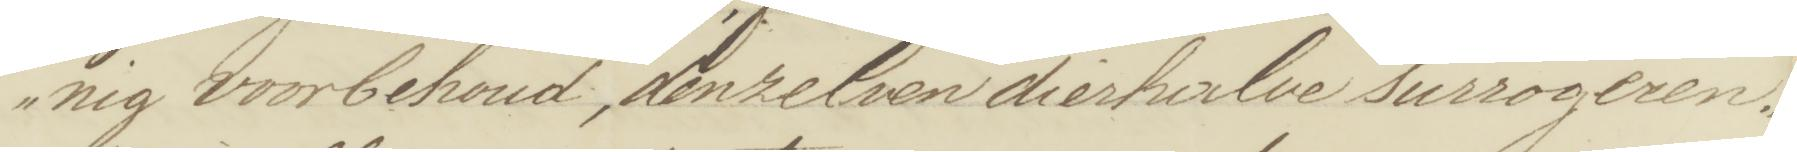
„nig voorbehoud, denzelven dierhalve surrogeren„
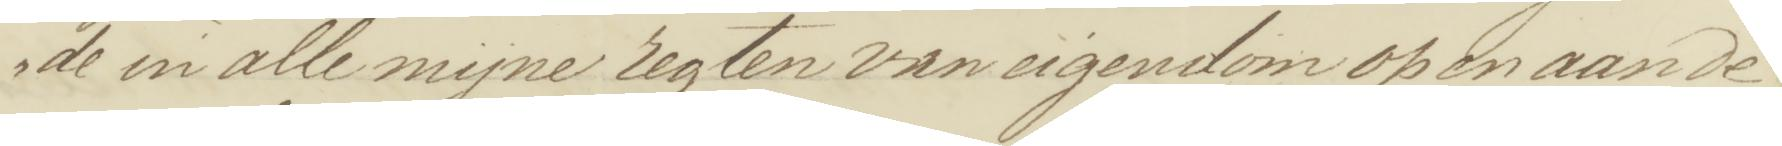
„de in alle mijne Regten van eigendom op en aan de
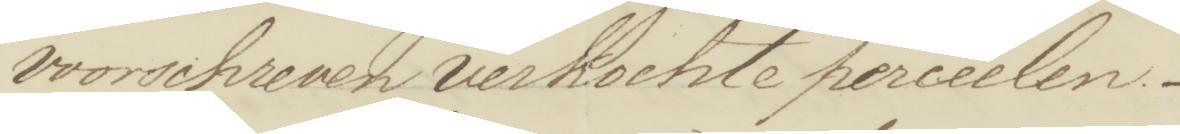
voorschreven verkochte perceelen. —
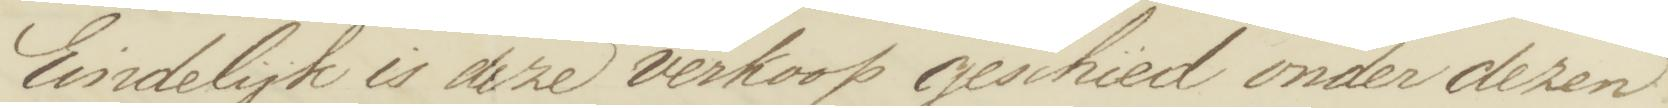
Eindelijk is deze verkoop geschied onder dezen
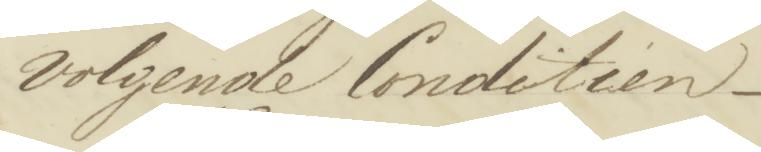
volgende Conditien —
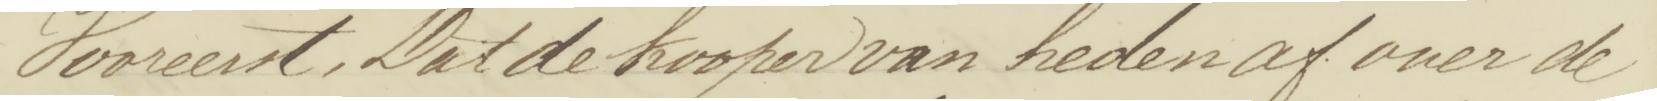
Vooreerst, Dat de kooper van heden af over de
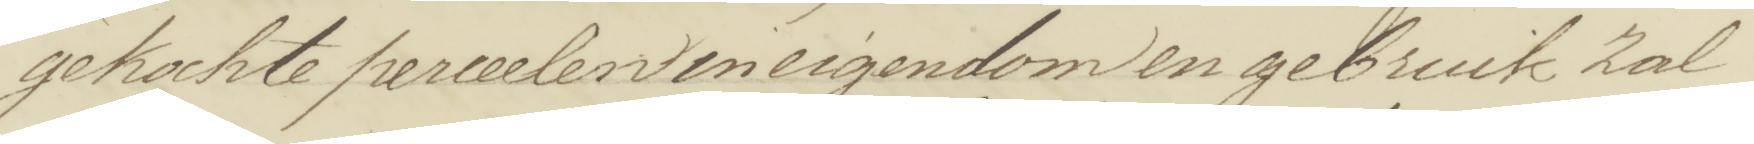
gekochte perceelen in eigendom en gebruik zal
